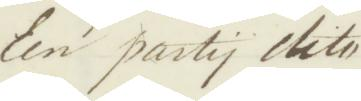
Een partij dito
